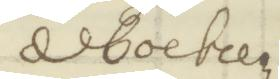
deboeken
